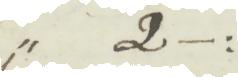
„ 2 —
